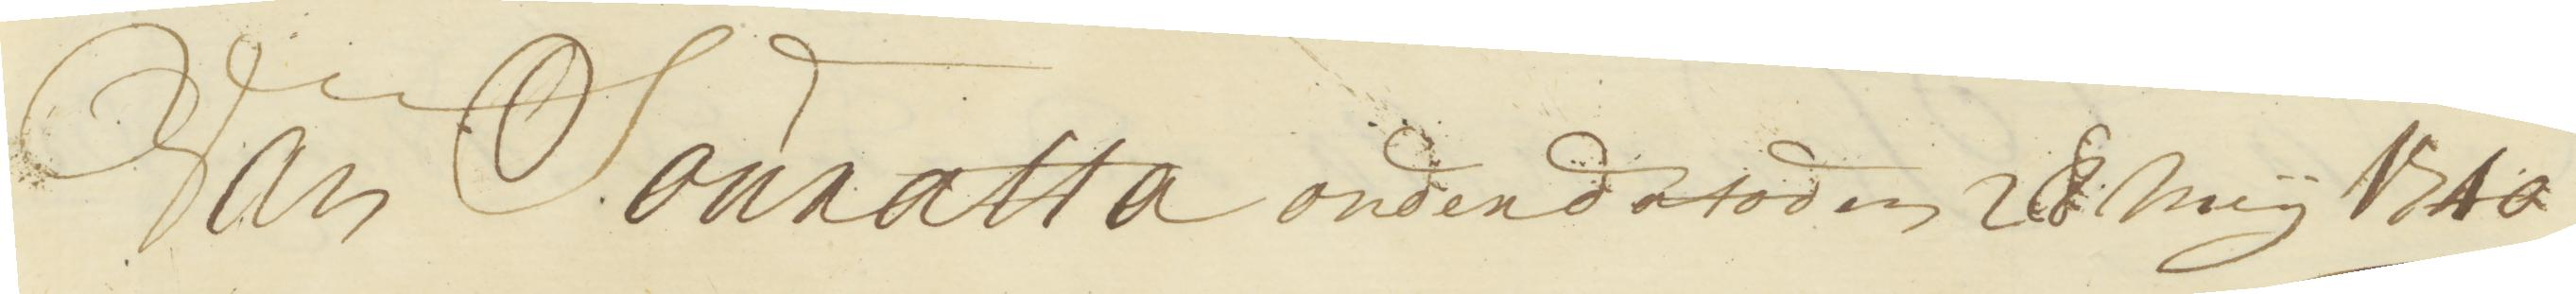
Van Souratta onder dato den 28: Meij 1740
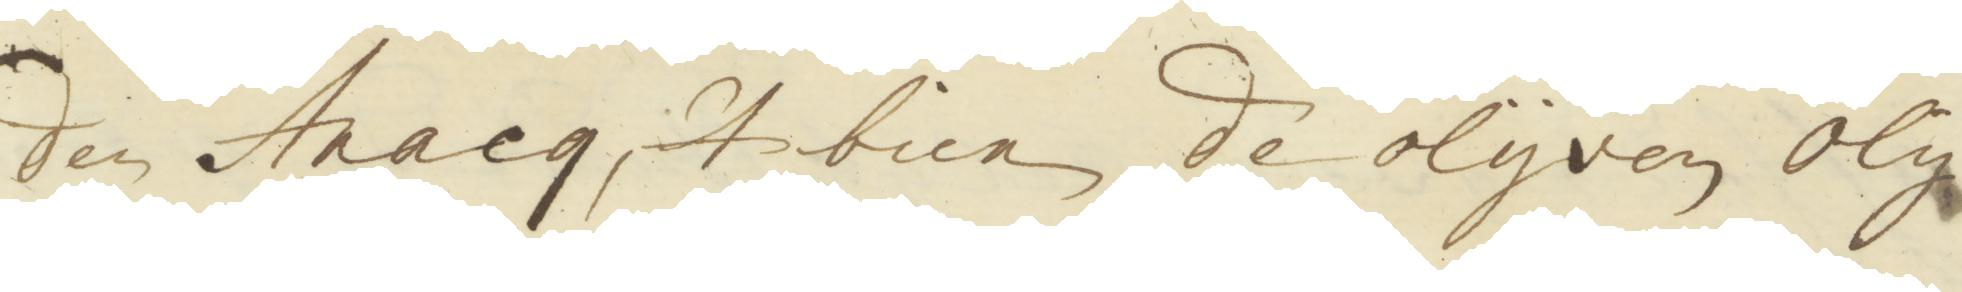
den Aracq, ’t bier de olijven olij
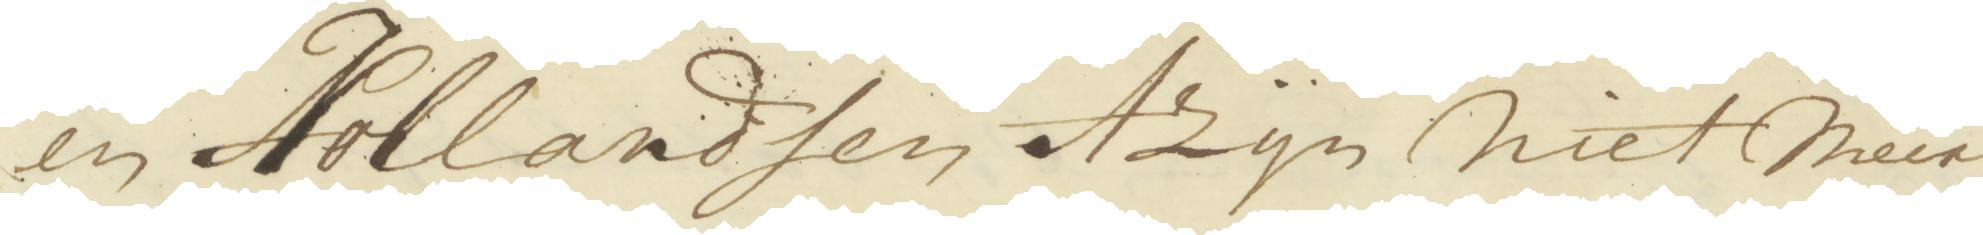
en Hollandsen Azijn Niet Meer
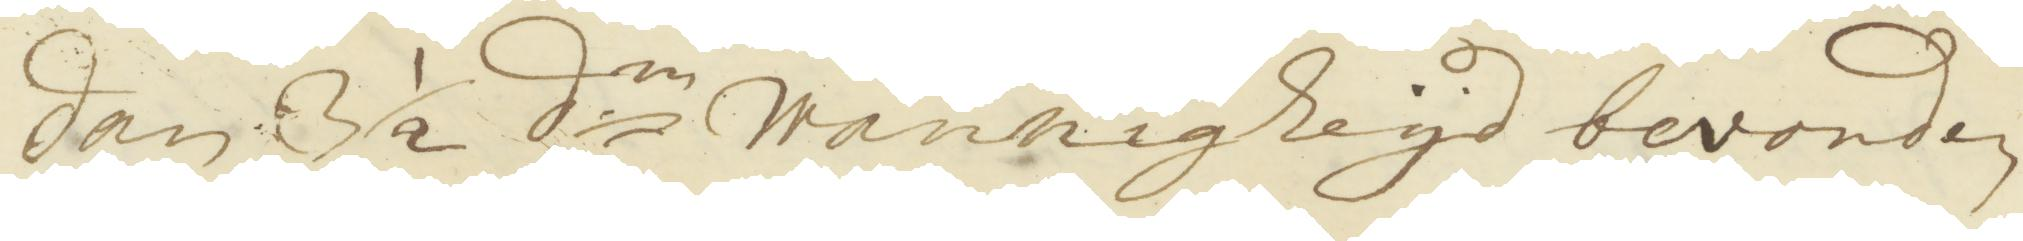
dan 3½ d=m wannigheijd bevonden
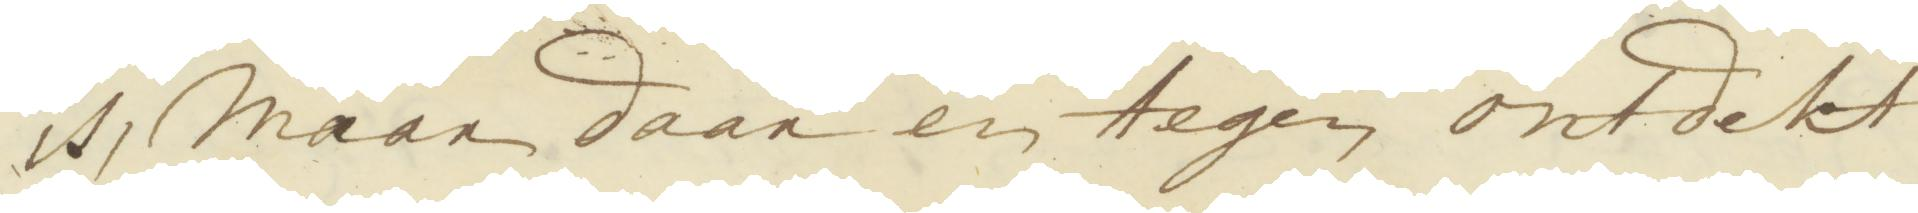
is, Maar daar en tegen ontdekt
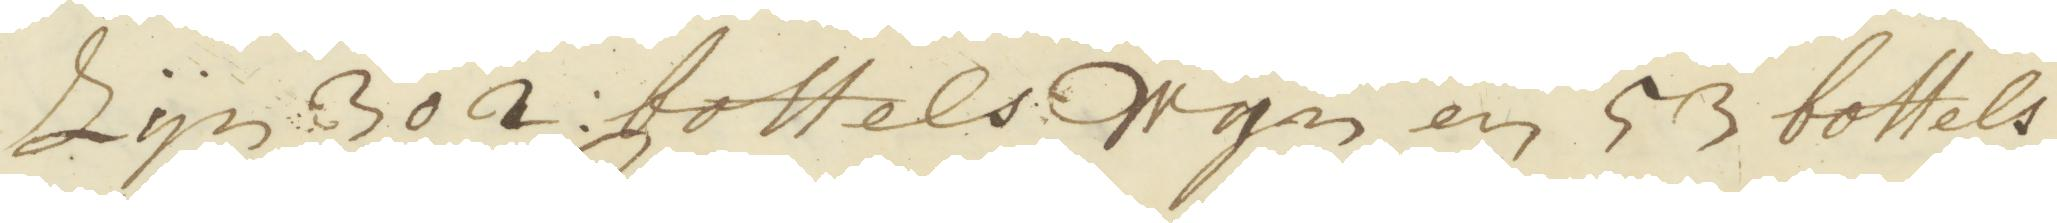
zijn 302: bottels wijn en 53 bottels
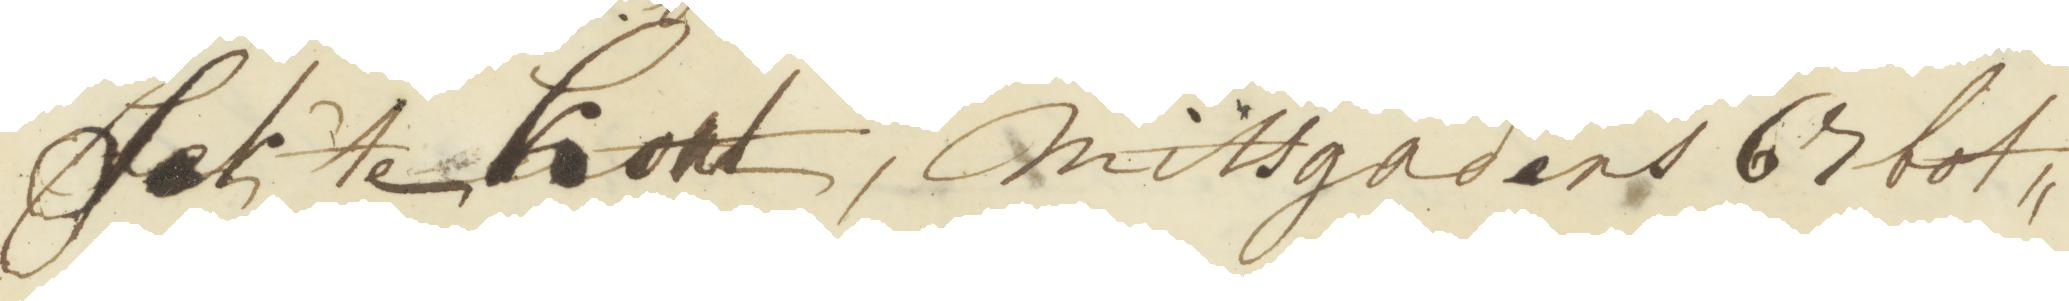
sek 'te kort, Mitsgaders 67 bot„
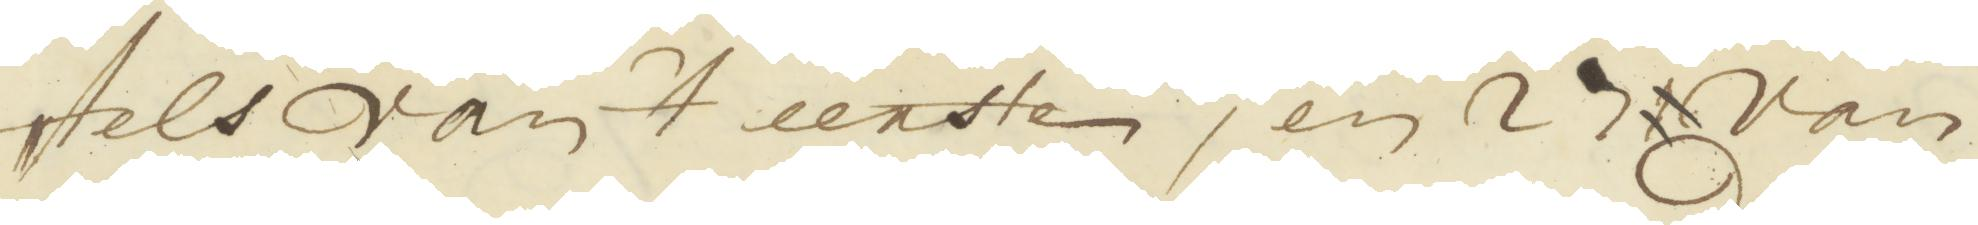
tels van ’t eerste, en 271 van
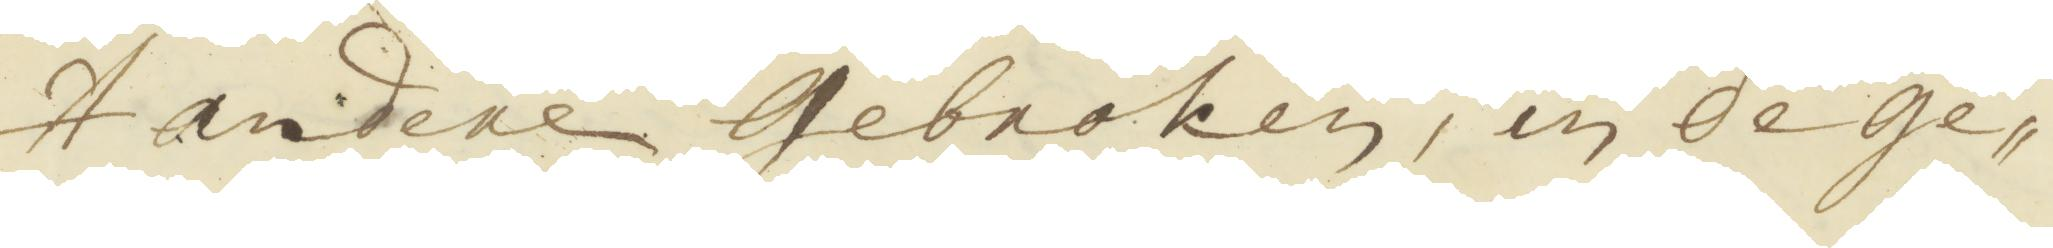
't andere Gebroken, in de ge„
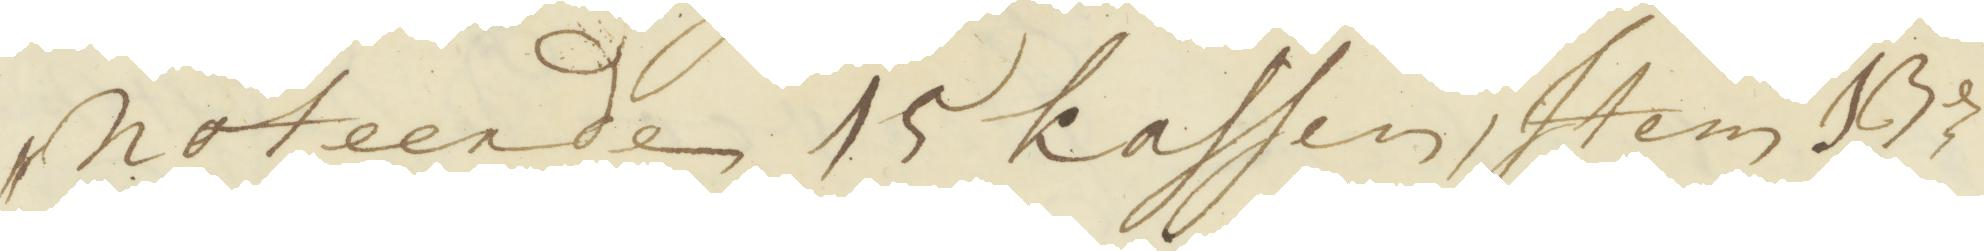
noteerde 15 kassen, Jtem 13„en
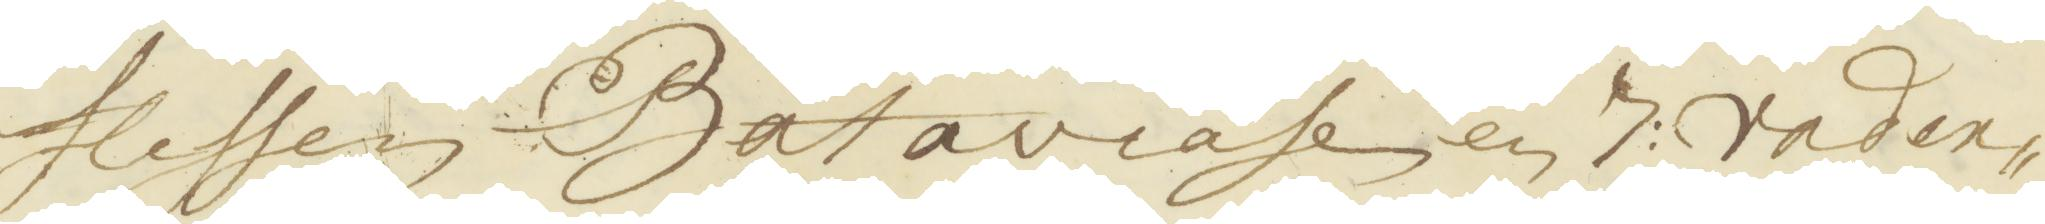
flessen Bataviase en 7: vader„
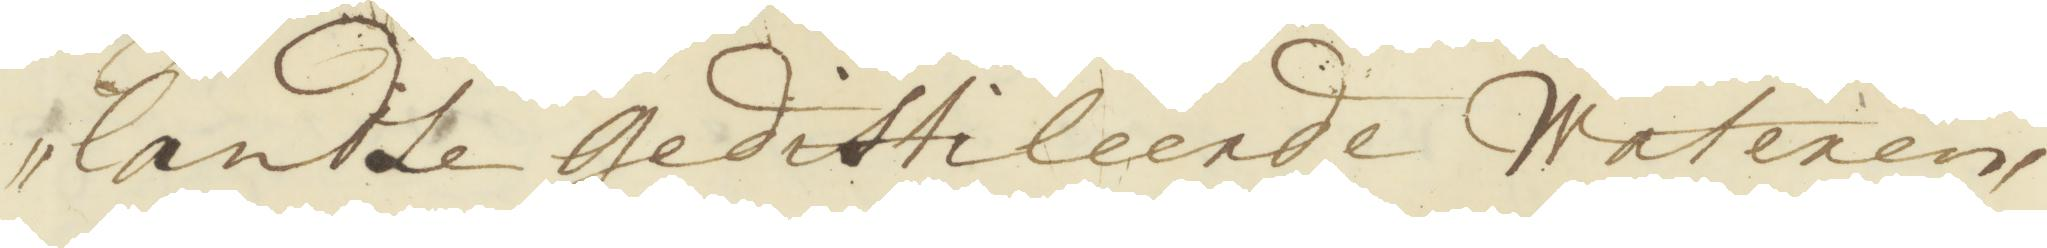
„landse Gedistileerde Wateren,
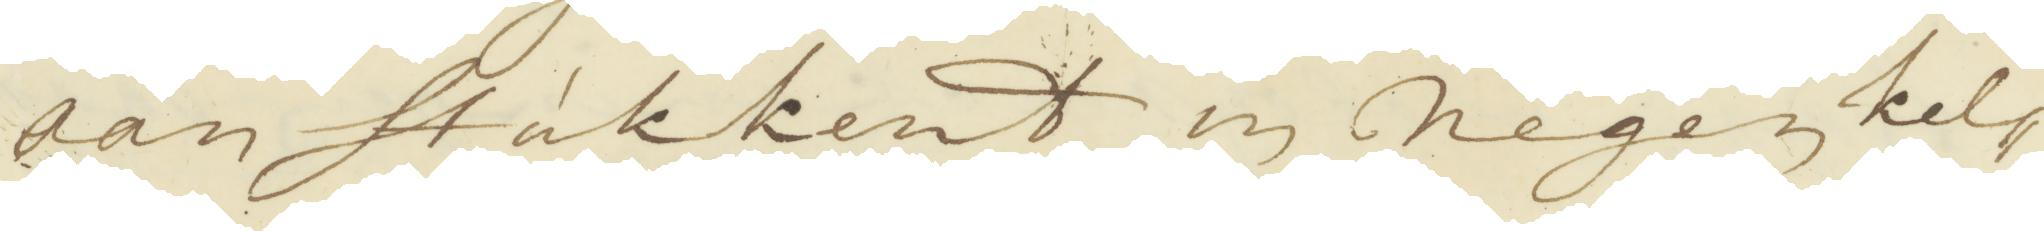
aan stukkent in Negen kel„
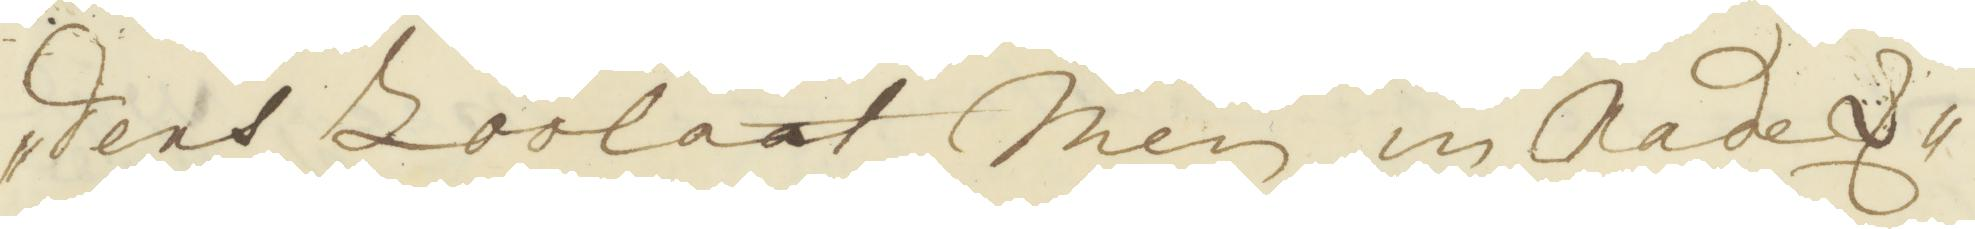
„ders zoolaat Men in Rade ver„
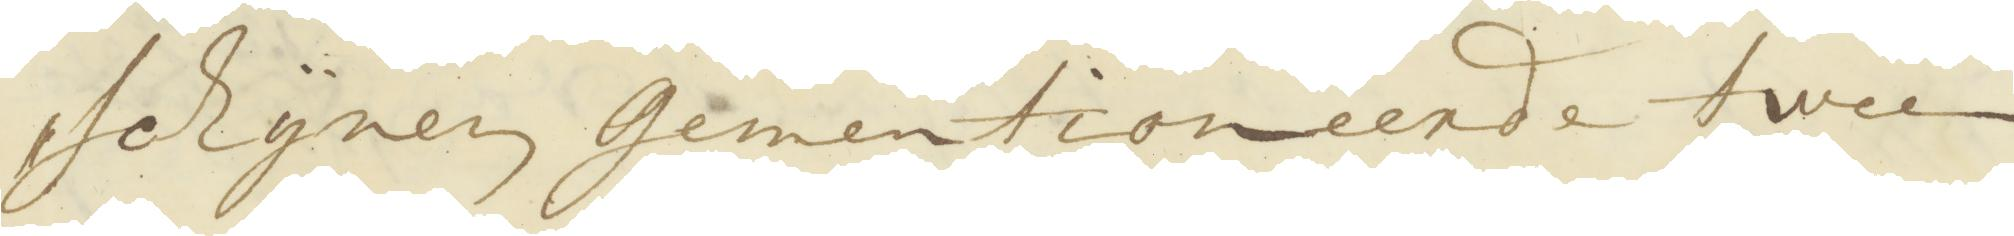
„schijnen Gementioneerde twee
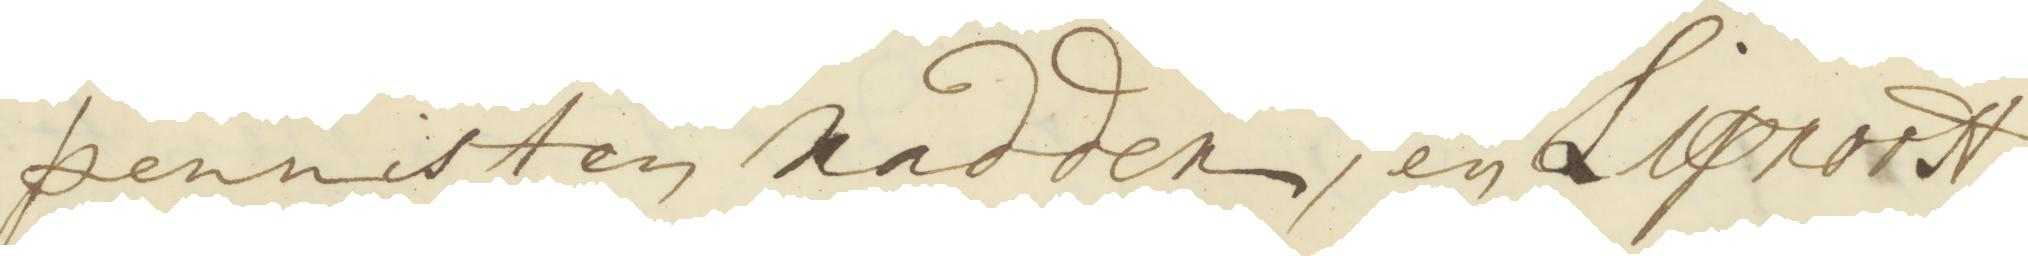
Pennisten Radder, en Liproost,
